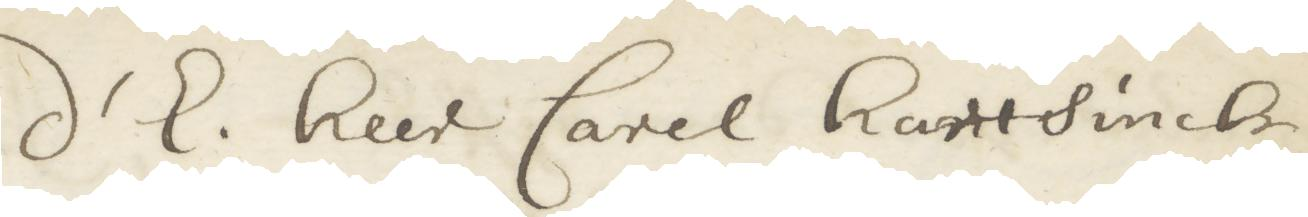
d’ E. heer Carel hartsinck
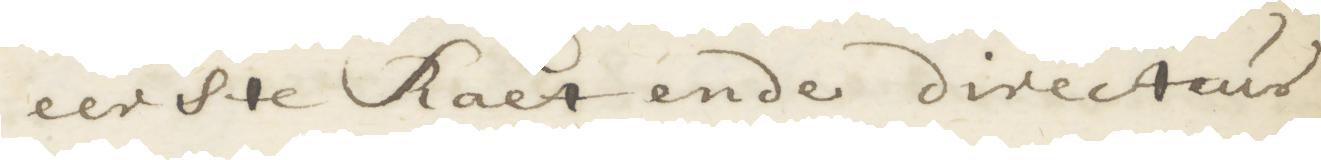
eerste Raet ende directeur
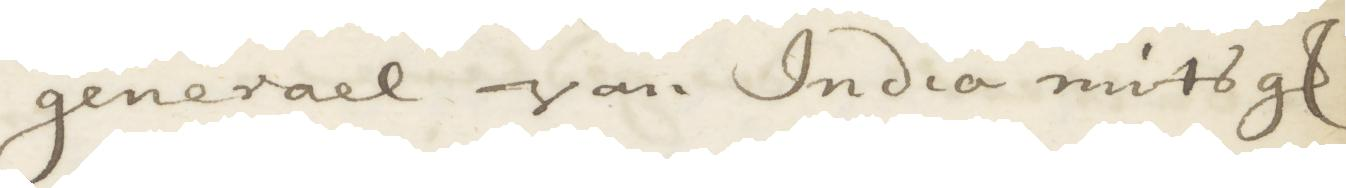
generael van India mitsg
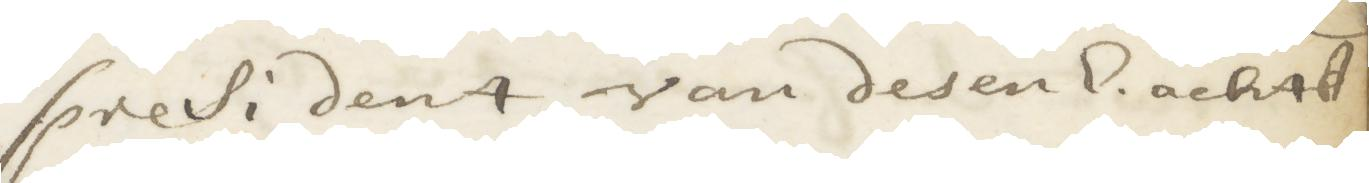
president van desen E. achtb
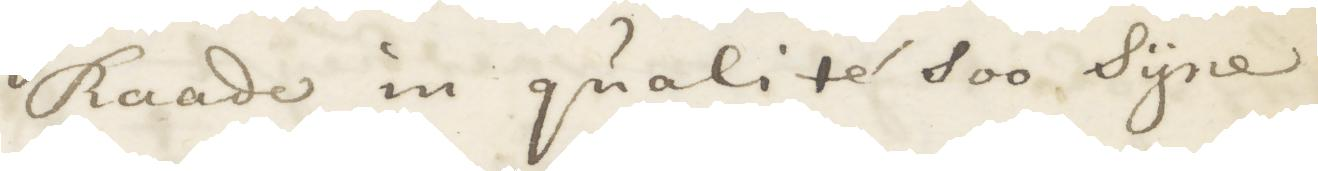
Raade in qualité soo sijne
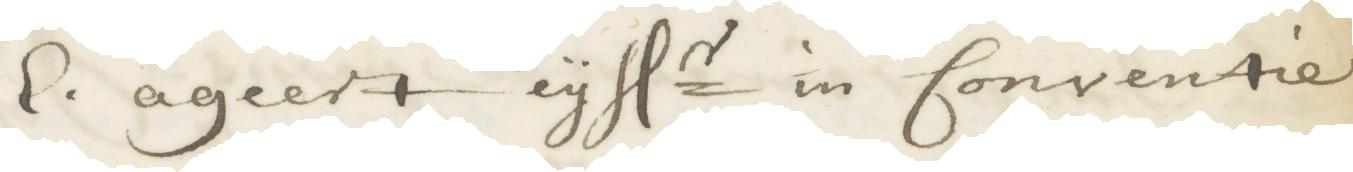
E. ageert eijss=r in Conventie
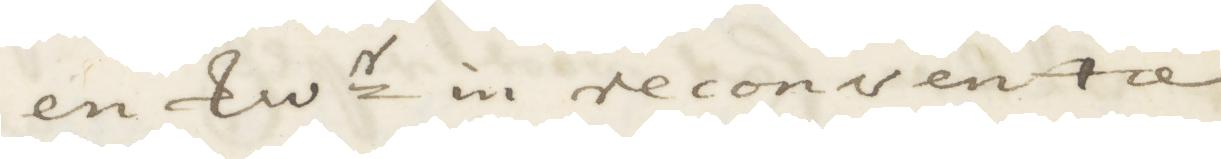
en verw=r in reconventie
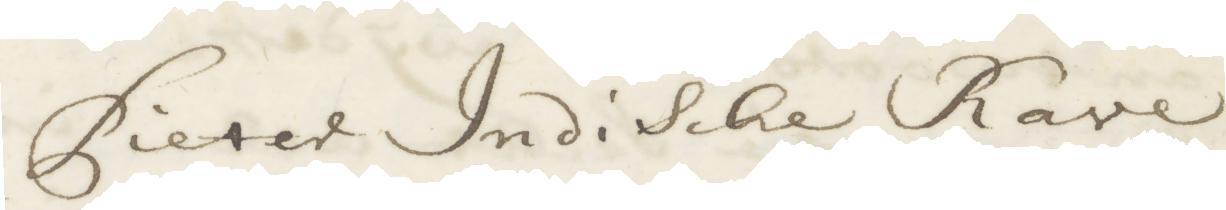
Pieter Indische Rave
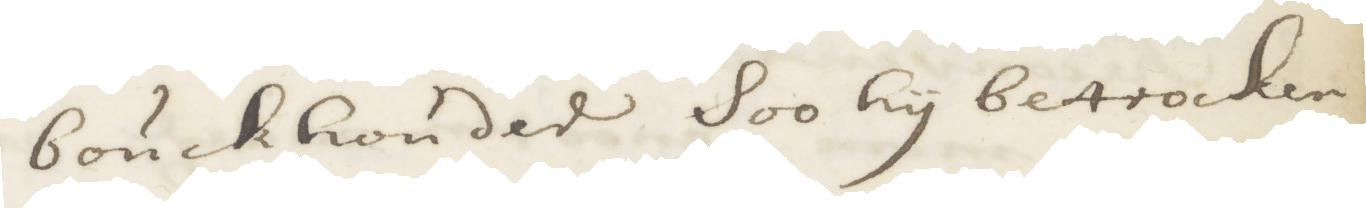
bouckhouder soo hij betrocken
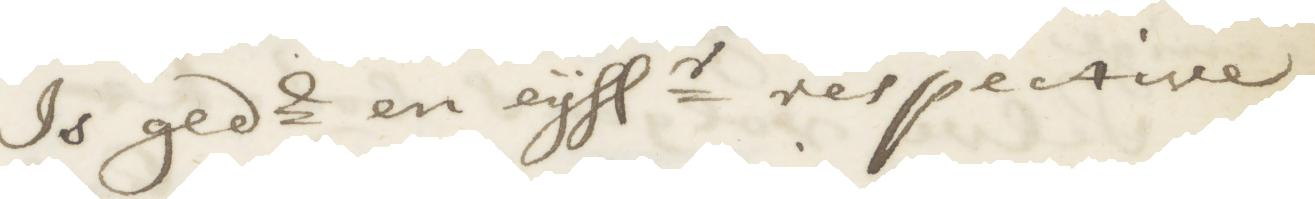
Is ged=e en eijss=r respective
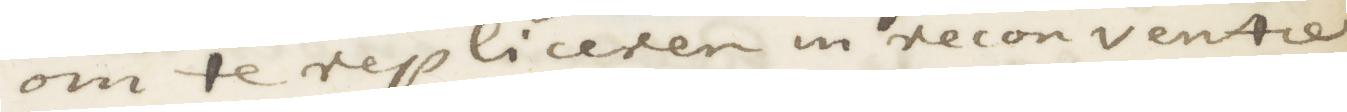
om te repliceren in reconventie
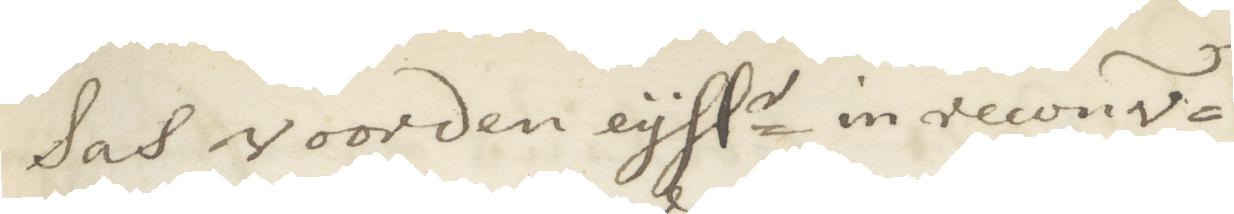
sas voor den eijss=r in reconv=
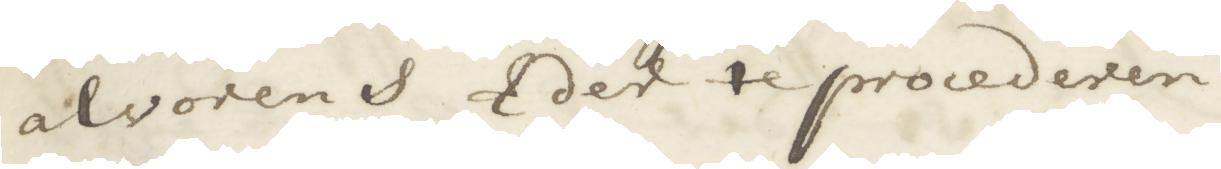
alvorens verder te procederen
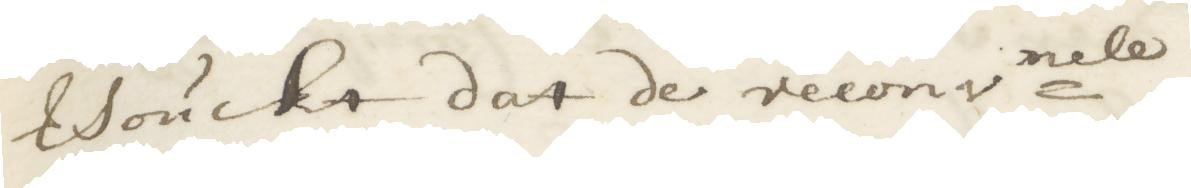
versouckt dat de reconv=nele
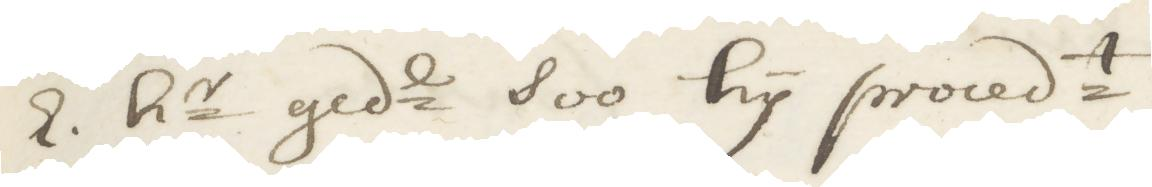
E. h=r ged=e soo hij proced=t
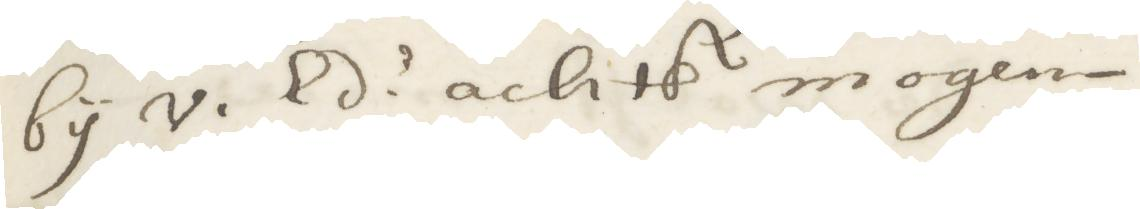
bij v. Ed.e achtb mogen
